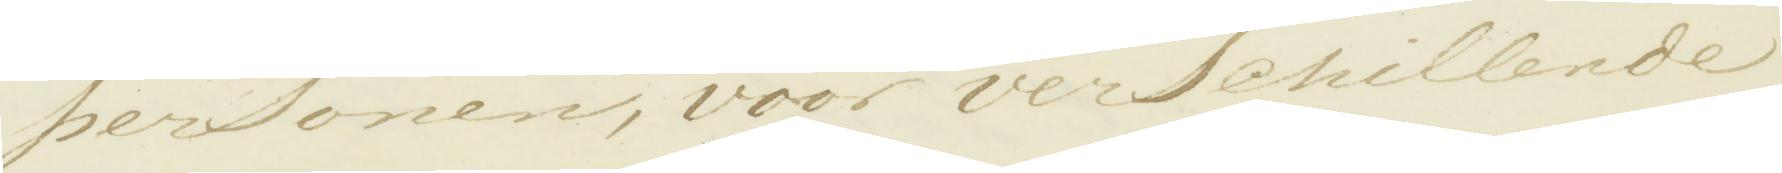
personen, voor verschillende
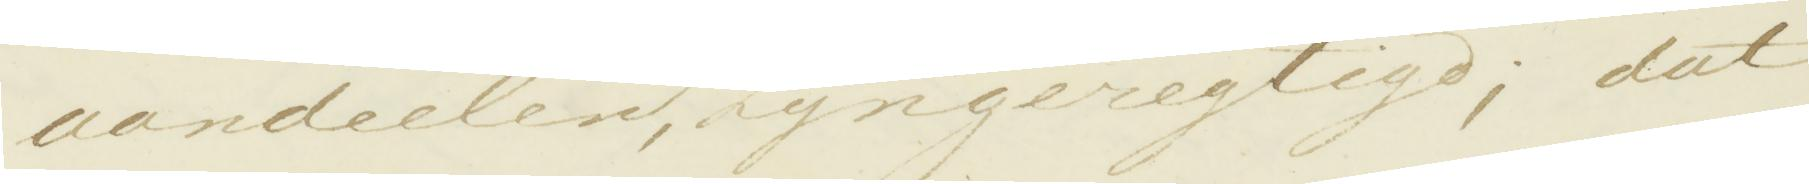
aandeelen, zijn geregtigd; dat
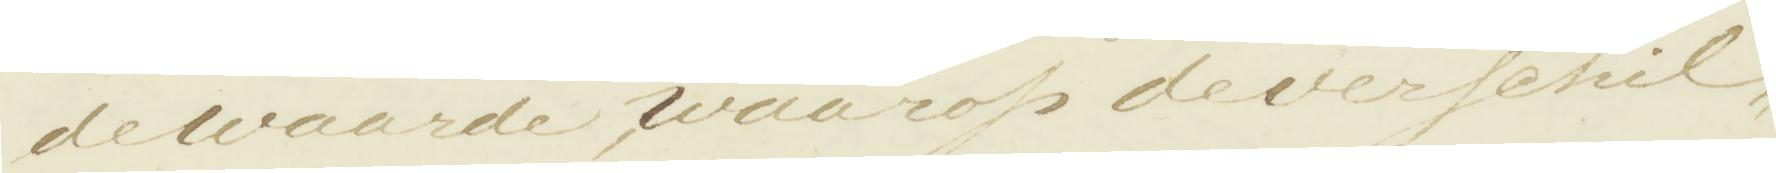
de waarde, waarop de verschil„
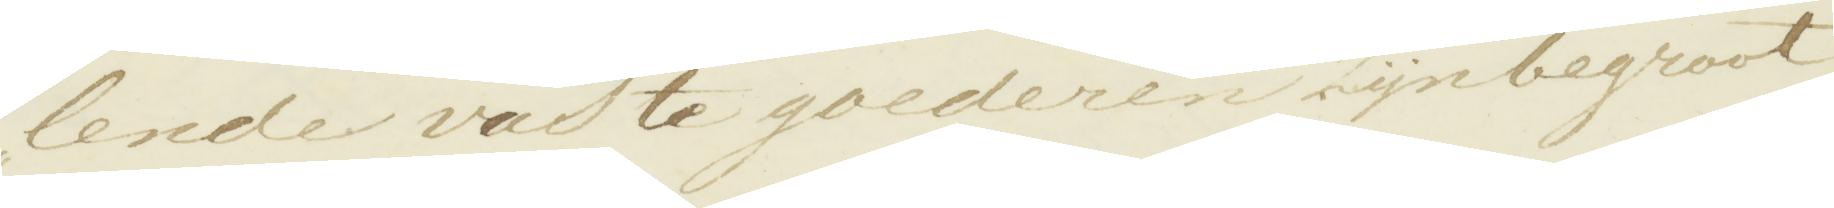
„lende vaste goederen zijn begroot,
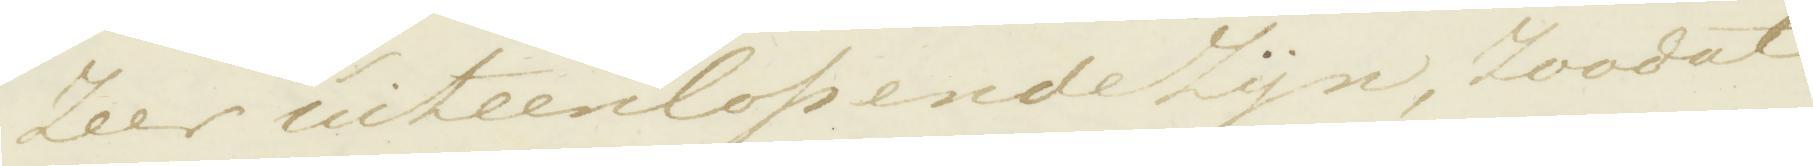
zeer uiteenlopende zijn, zoodat
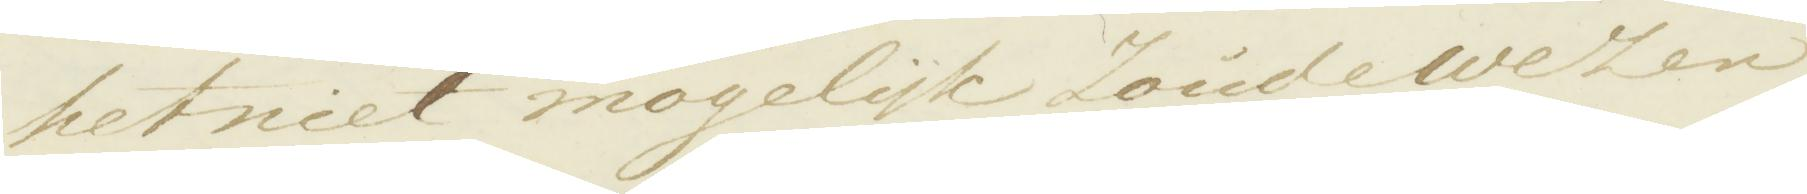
het niet mogelijk zoude wezen
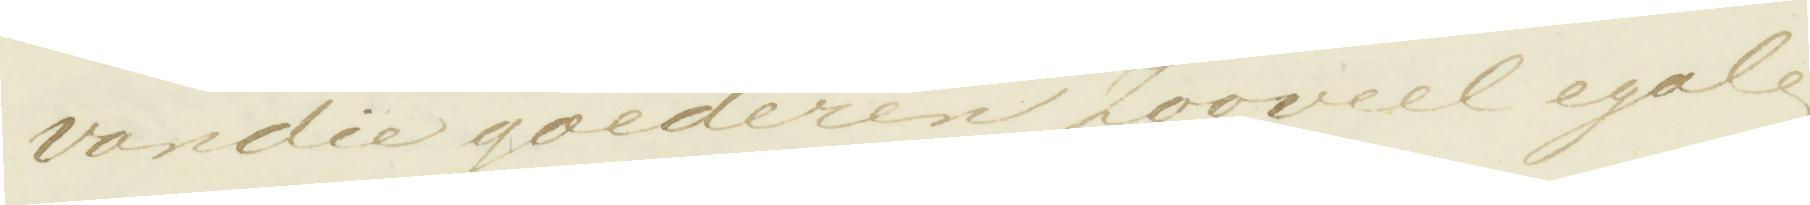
van die goederen zooveel egalen
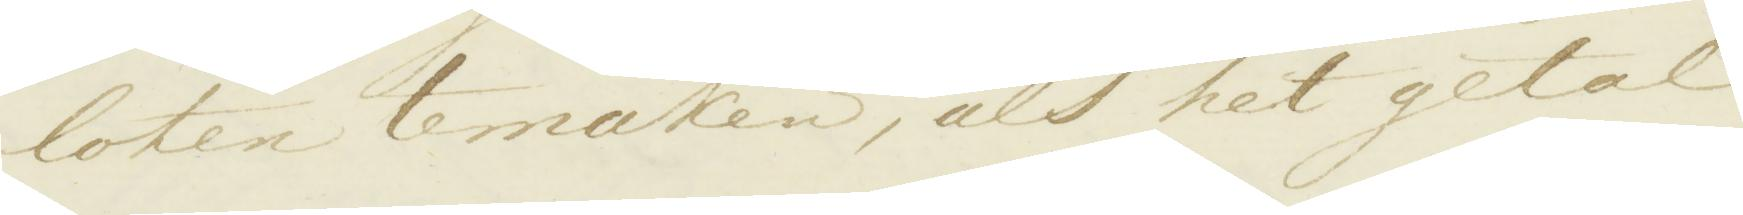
loten temaken, als het getal
